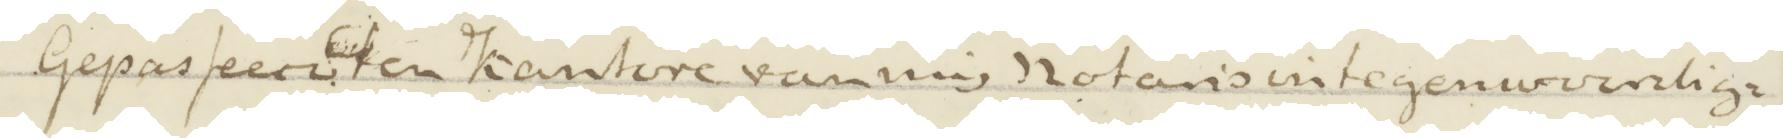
Gepasseerd ten Kantore van mij Notaris in tegenwoordig=
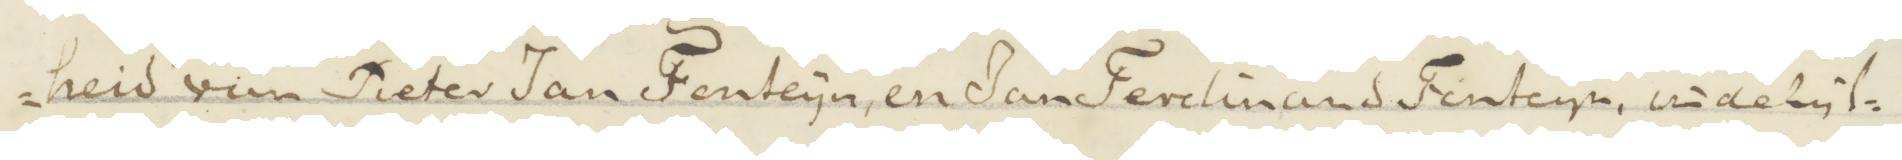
=heid van Pieter Ian Fonteijn, en Ian Ferdinand Fonteyn, in de zijl=
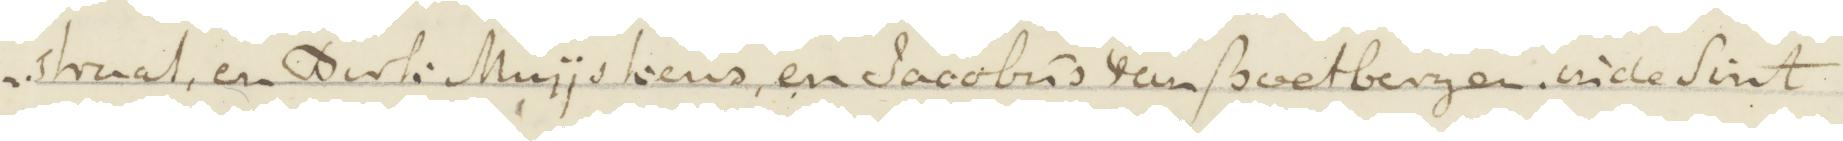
„straat en Dirk Muijskens, en Jacobus van Boetbergen, in de Sint
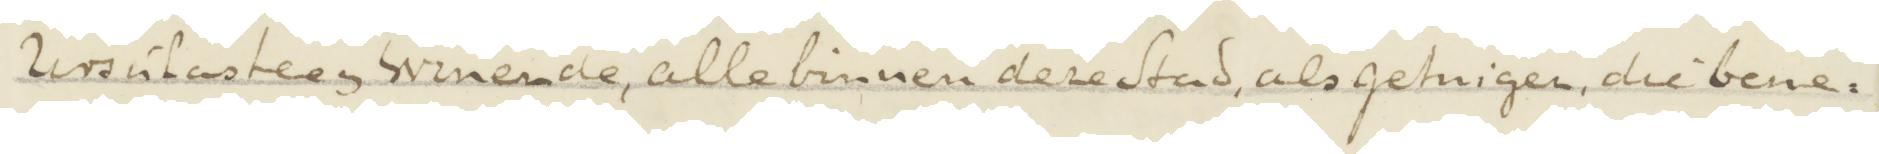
Ursulasteeg wonende alle binnen deze stad, als getuigen, die bene=
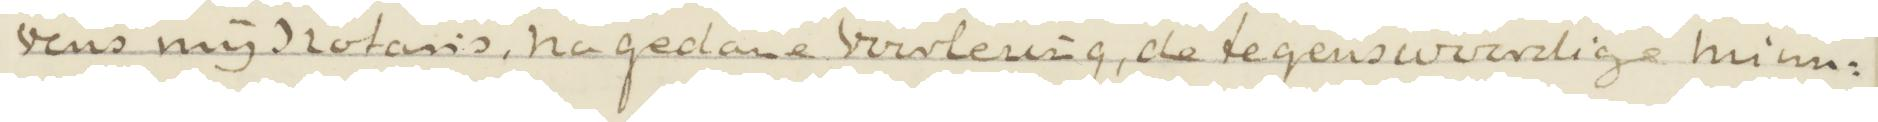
vens mij Notaris, na gedane voorlezing, de tegenswoordige minu:
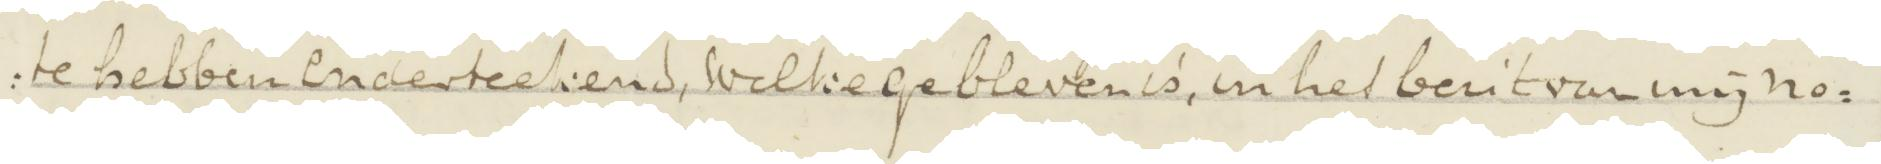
:te hebben onderteekend, welke gebleven is in het bezit van mij no=
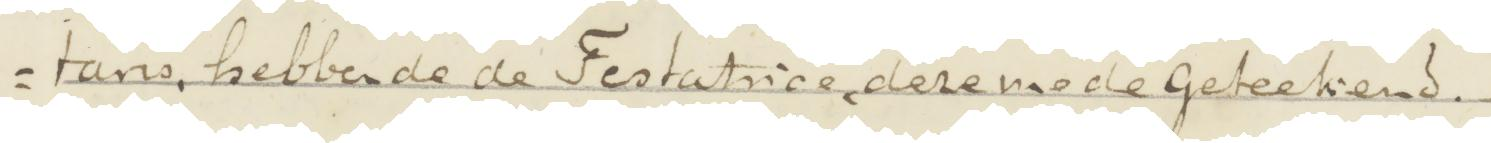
=taris, hebbende de Testatrice, deze mede geteekend.
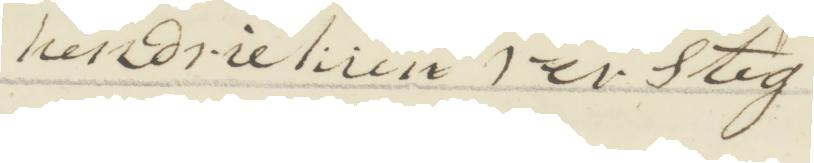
hendrikien ver steg
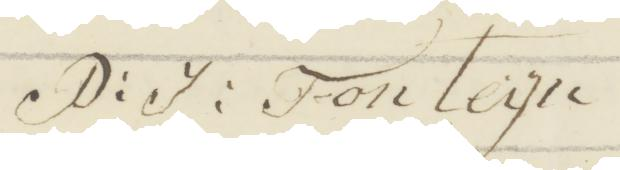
P: J: Fonteijn
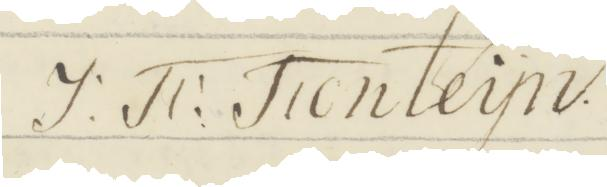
J. F: Fonteijn
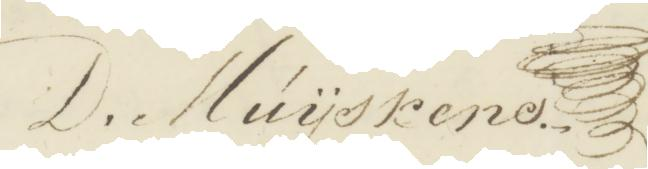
D: Muijskens
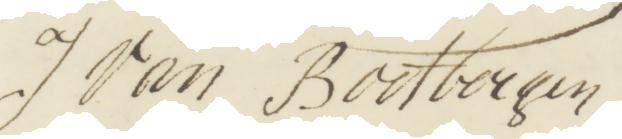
J Van Boetbergen
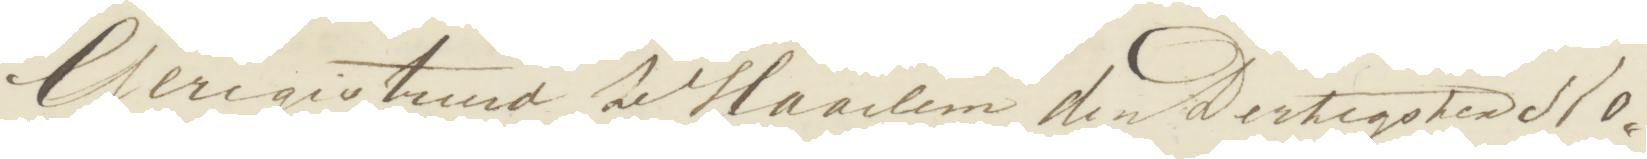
Geregistreerd te Haarlem den Dertigsten No„
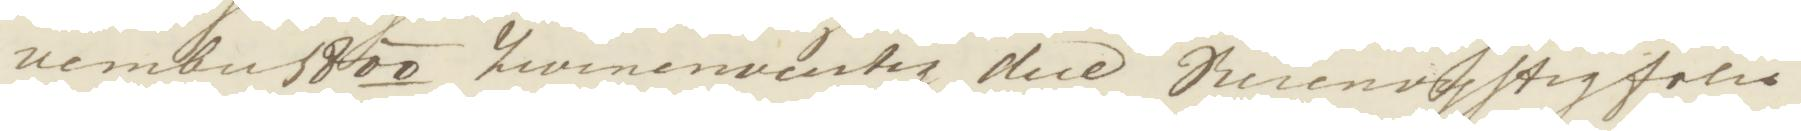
vember 1800 Zevenenveertig deel Vierenvyftig folio
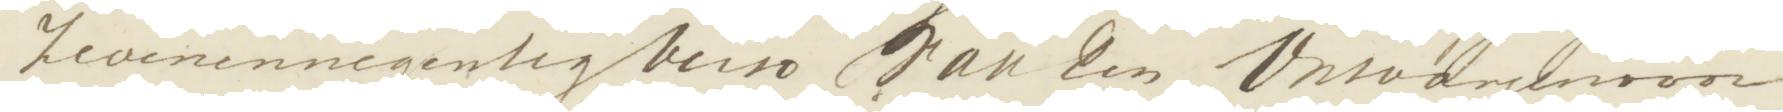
Zevenennegentig verso Vak Een. Ontvangen voor
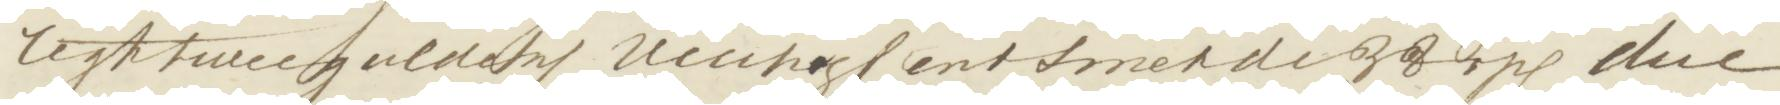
regt twee guldens veertig cents met de 38% opc drie
